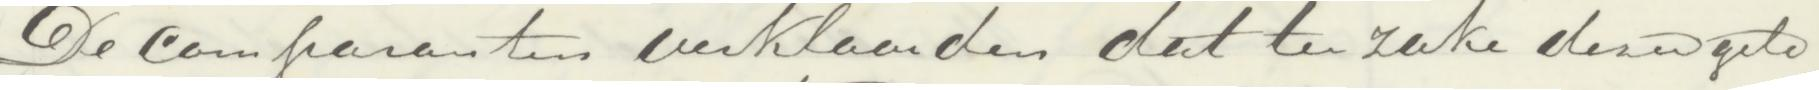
De Comparanten verklaarden dat ter zake dezer geld
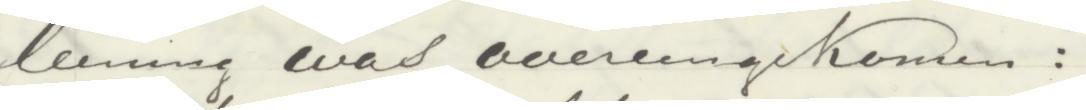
leening was overeengekomen:
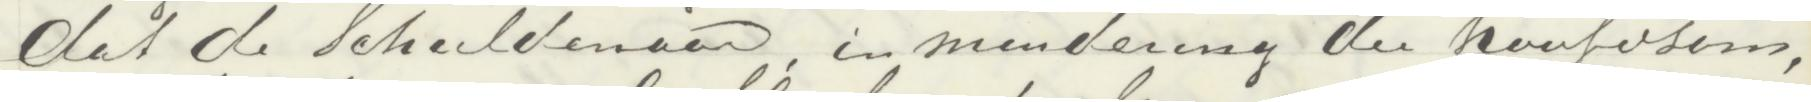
dat de schuldenaar in mindering der hoofdsom,
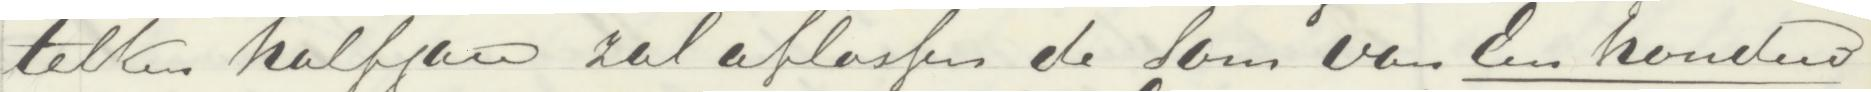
telken halfjare zal aflossen de som van Een honderd
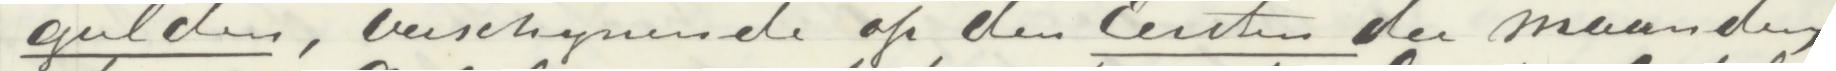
gulden, verschynende op den Eersten der maanden
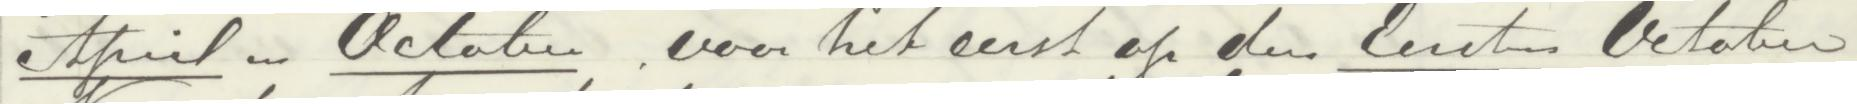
April en October, voor het eerst op den Eersten October
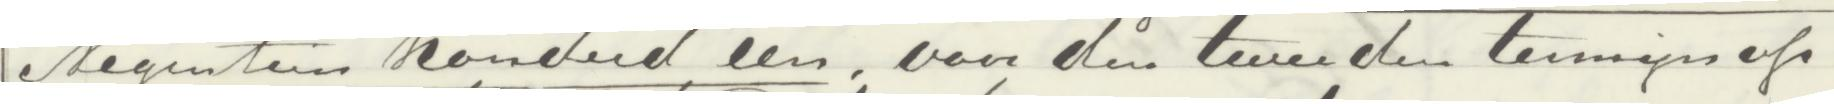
Negenten honderd een, voor den tweeden termijn op
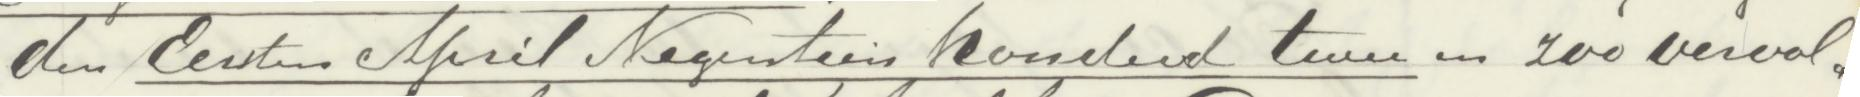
den Eersten April Negentien honderd twee en zoo vervol„
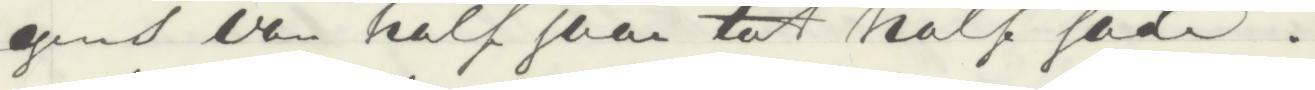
gens van half jaar tot half jaar.
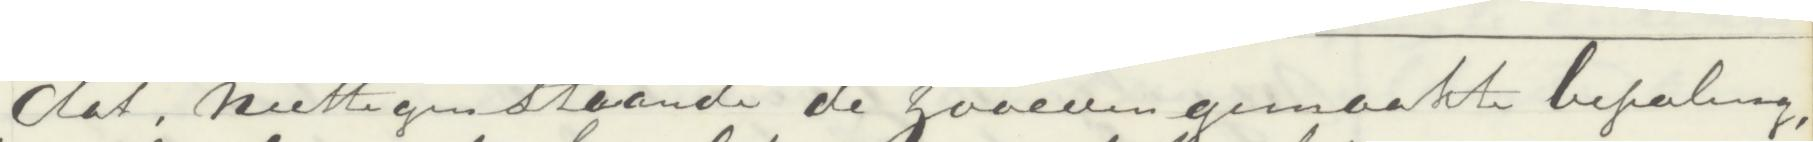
dat, niettegenstaande de zooeven gemaakte bepaling,
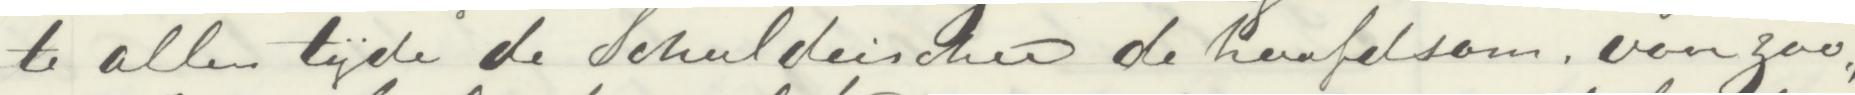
te allen tijde de schuldeischer de hoofdsom, voor zoo„
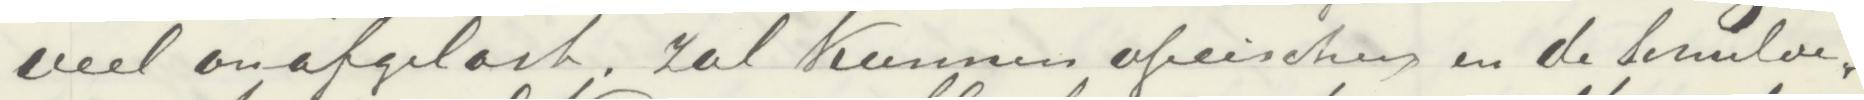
veel onafgelost, zal kunnen opeischen en de schulde„
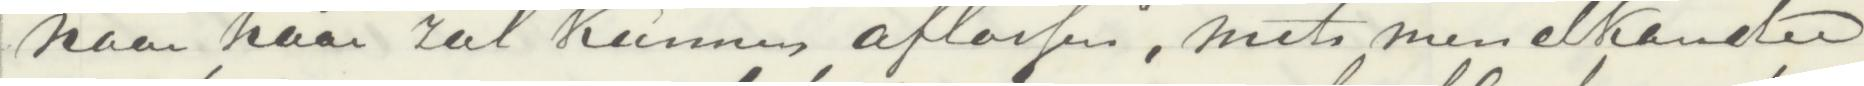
naar haar zal kunnen aflossen, mits men elkander
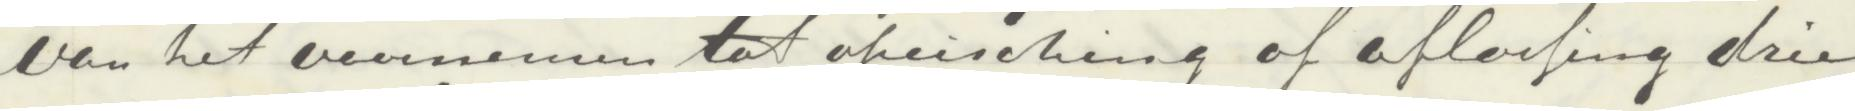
van het voornemen tot opeisching of aflossing drie
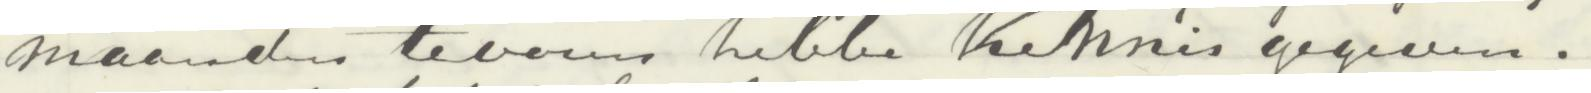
maanden tevoren hebbe kennis gegeven.
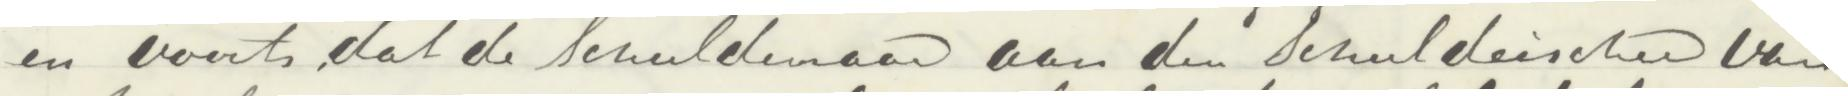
en voorts, dat de schuldenaar aan den schuldeischer van
